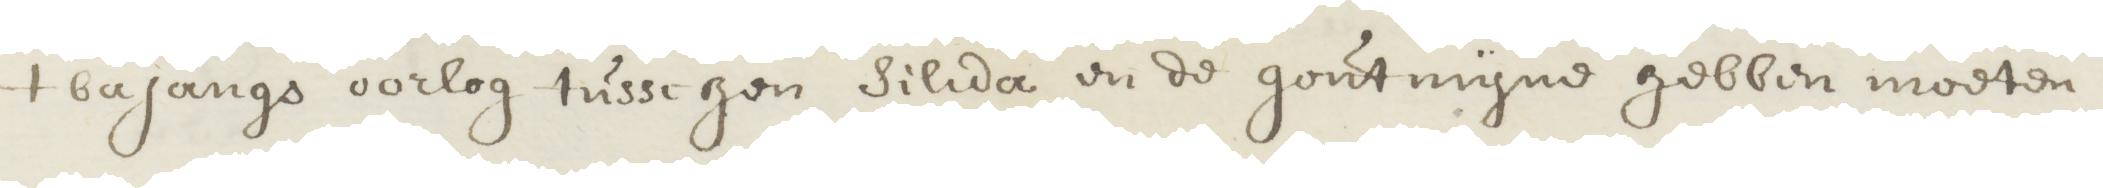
’t bajangs oorlog tusschen Silida en de goutmijne hebben moeten
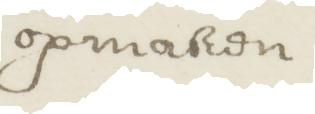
opmaken
